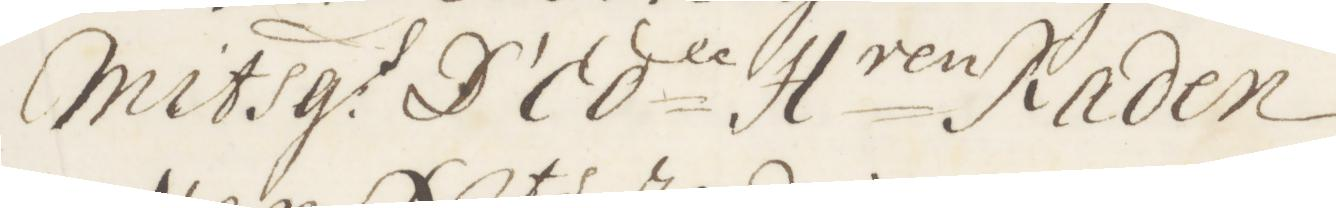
mitsg:s D' Ed=le H=ren Raden
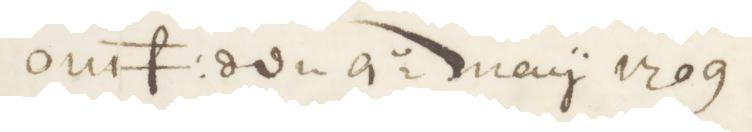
ontf: den 4:' maij 1709
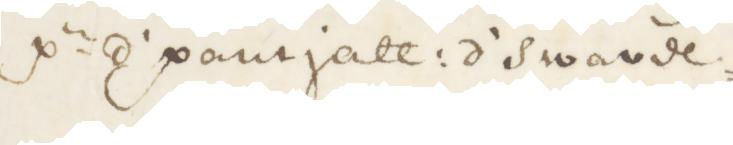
p:r d’ pantjall: d’ swavel
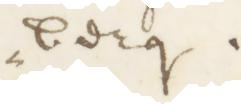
„berg
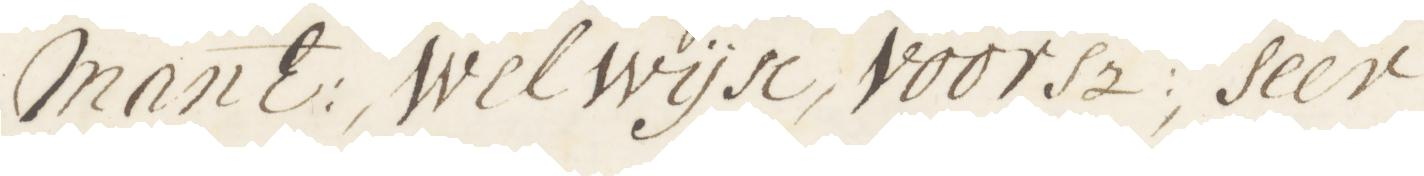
manh:, wel wijse, voorsz:, seer
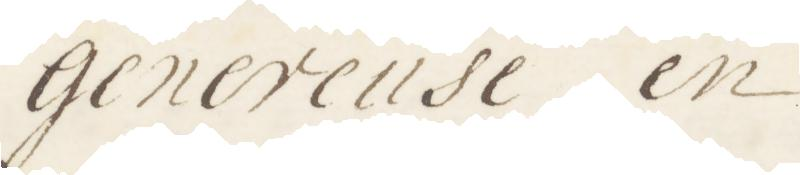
genereuse, en
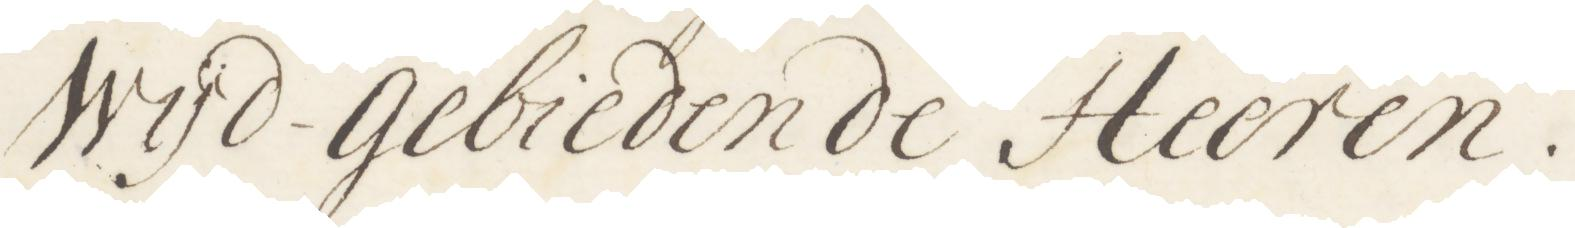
wijd-gebiedende Heeren.
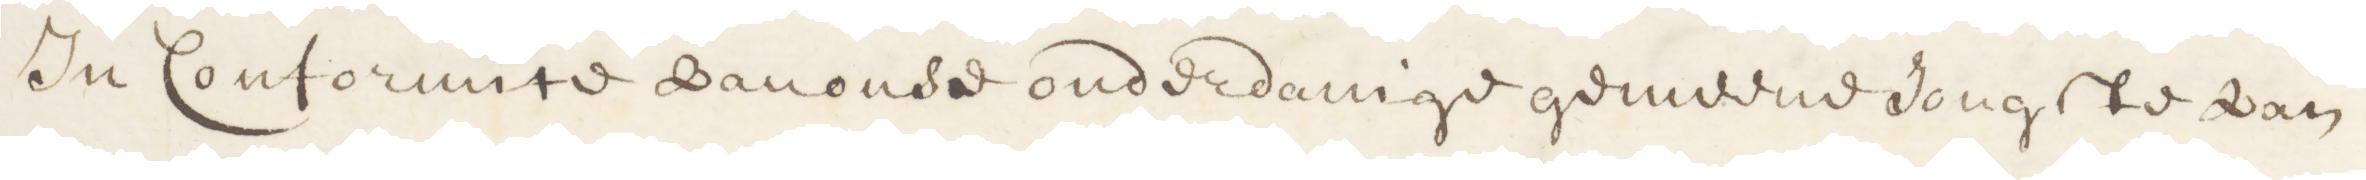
In Conformite van onse onderdanige gemeene Iongste van
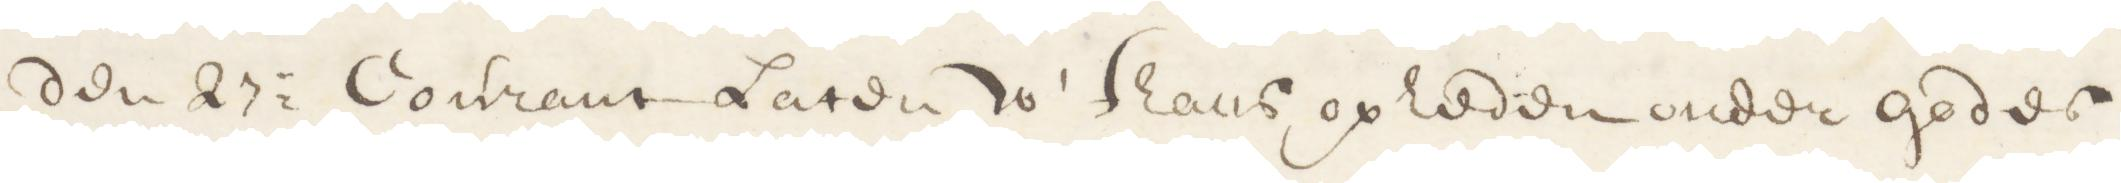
den 27:' Courant laten w' thans op heden onder godes
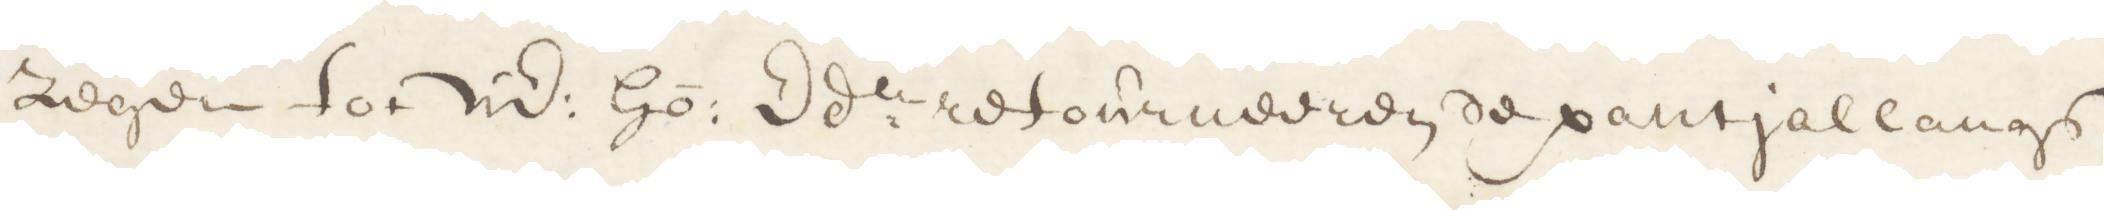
zegen tot uE: ho: Ed:le retourneeren de pantjallangs
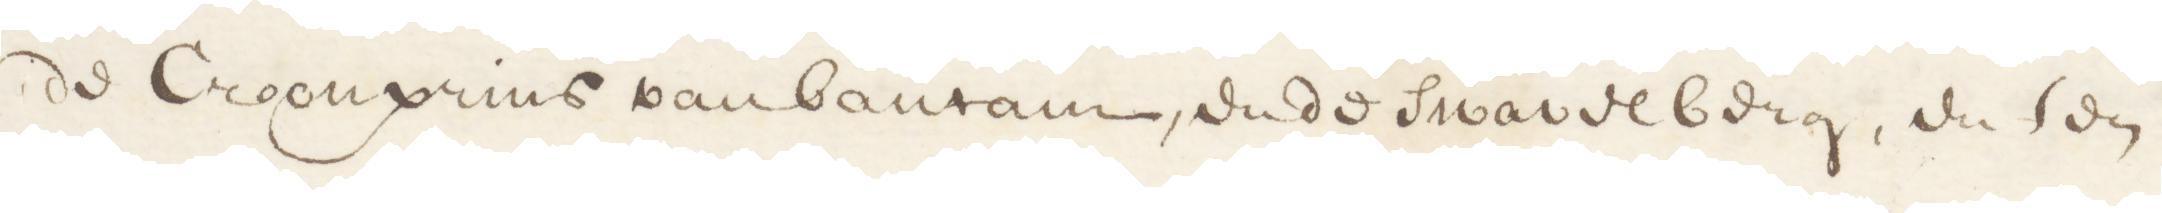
de Croonprins van bantam, en de swavelberg, en ten
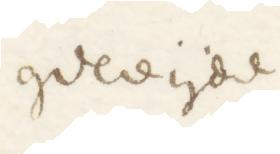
geleijde
